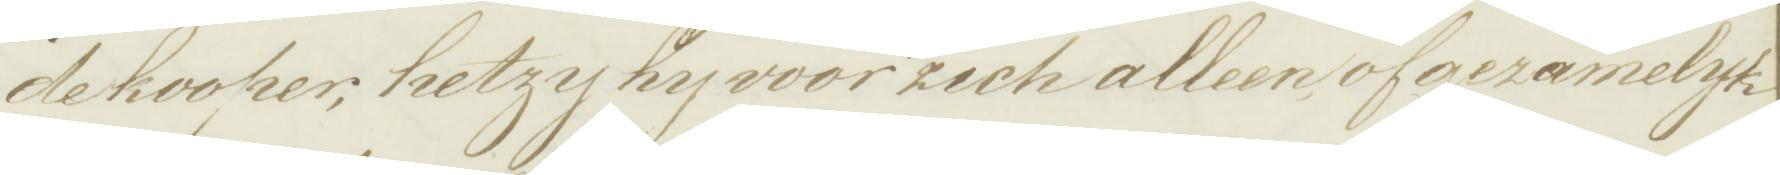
de kooper, hetzy hy voor zich alleen of gezamelyk
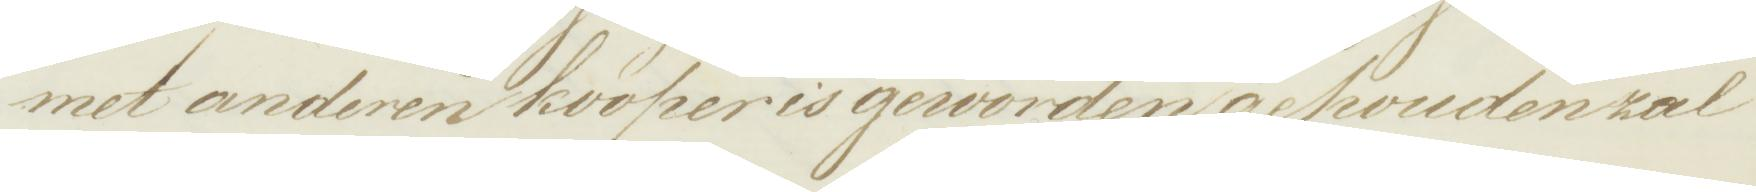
met anderen kooper is geworden, gehouden zal
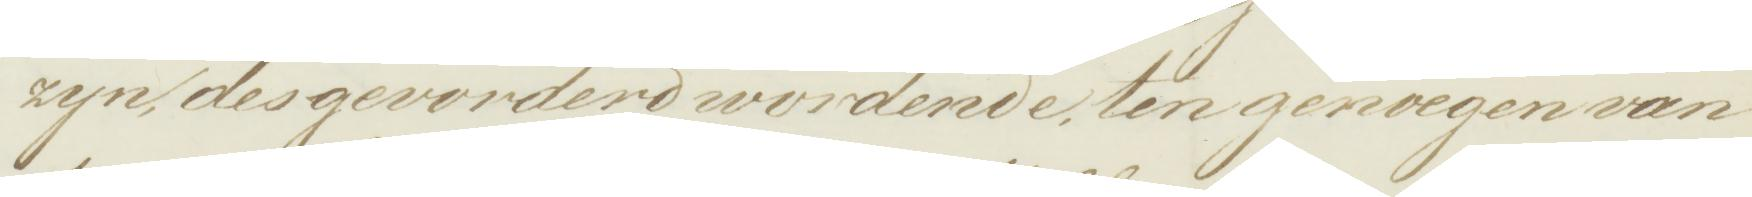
zyn, des gevorderd wordende, ten genoegen van
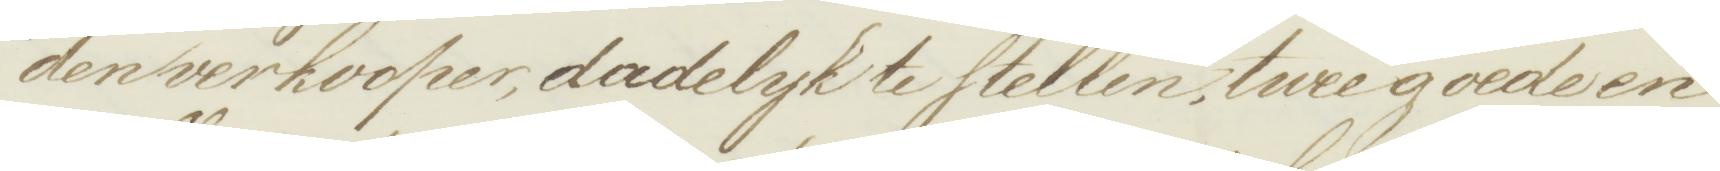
den verkooper, dadelyk te stellen, twee goede en
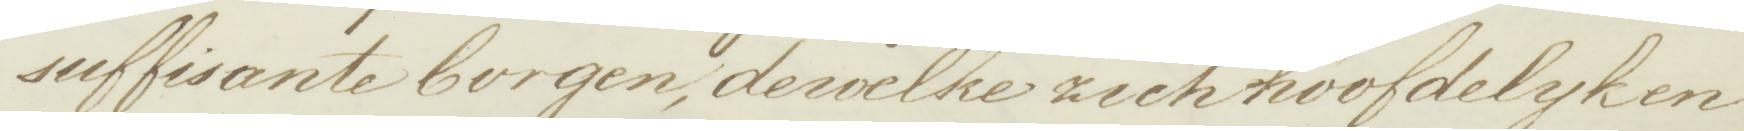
suffisante borgen, dewelke zich hoofdelyk en
